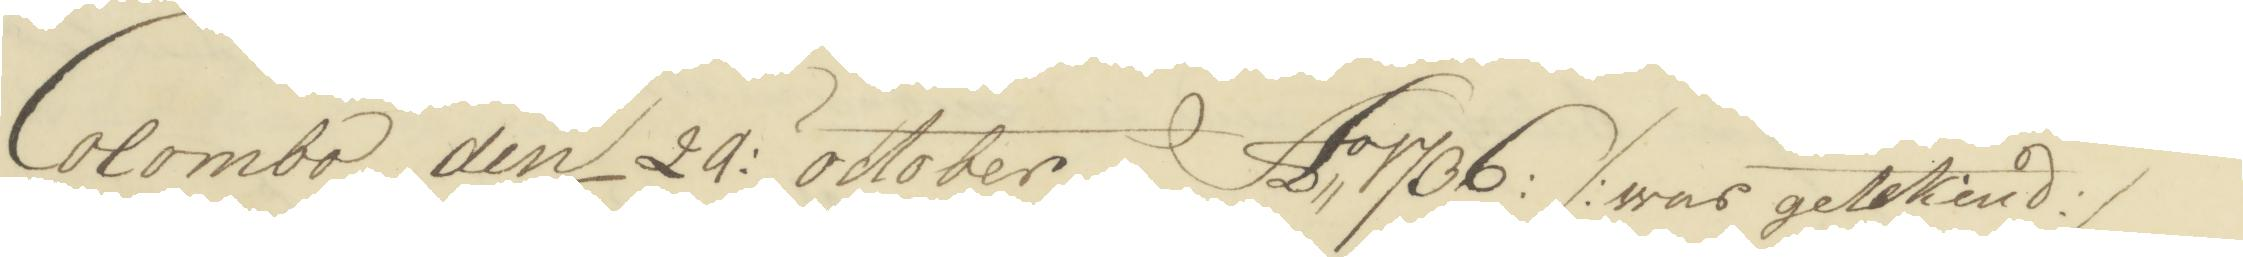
Colombo den 24:' october A„o 1736: /:was getekend:/
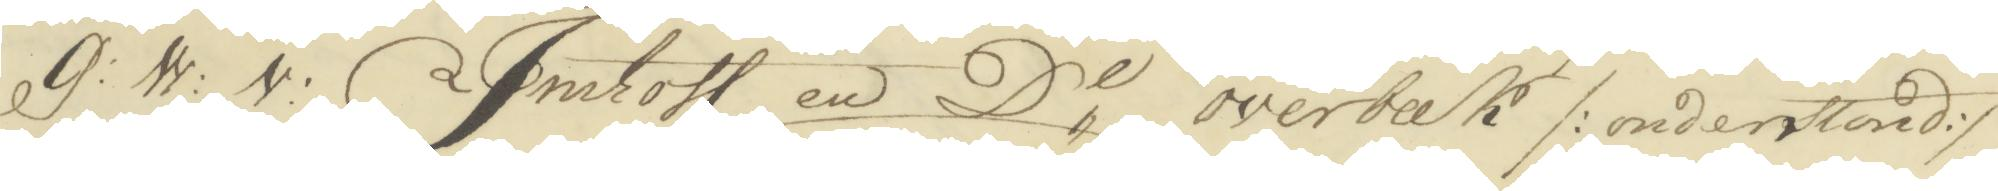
G: W: v: Jmhoff, en D„l overbeek /:onderstond:/
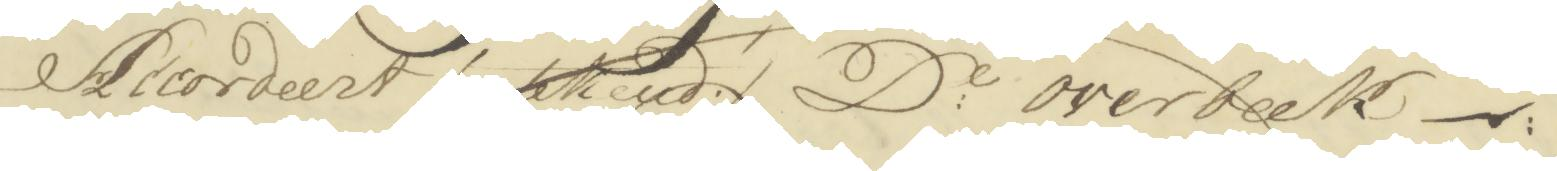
Accordeert (:getekend:/ D:l overbeek —:
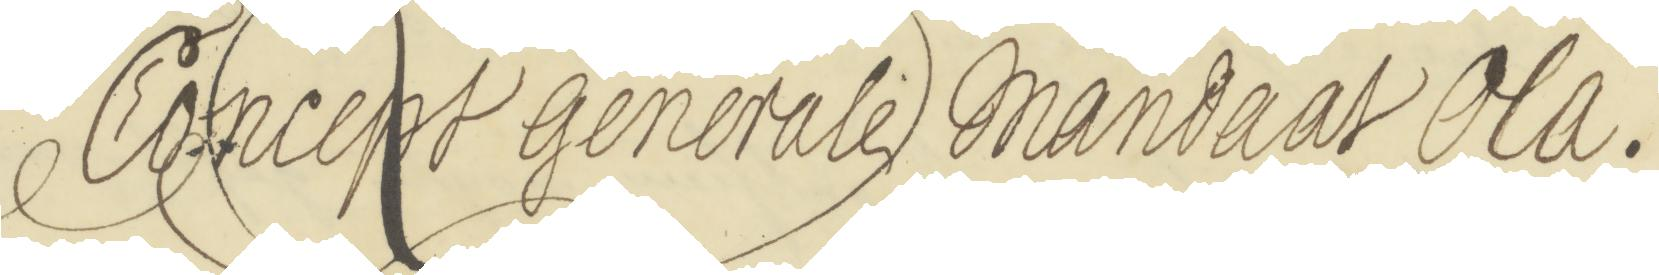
Concept generale Mandaat ola.
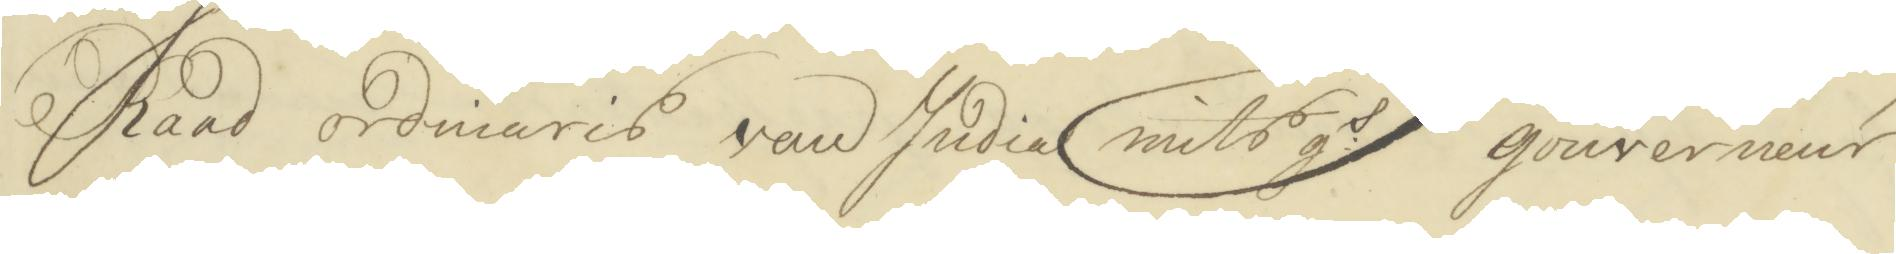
Raad ordinaris van Jndia mitsg:s gouverneur
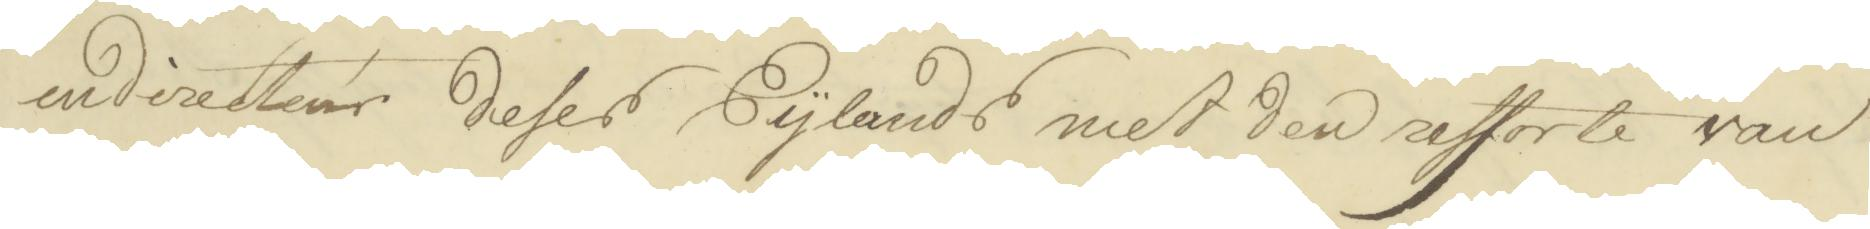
en directeur deses Eijlands met den ressorte van
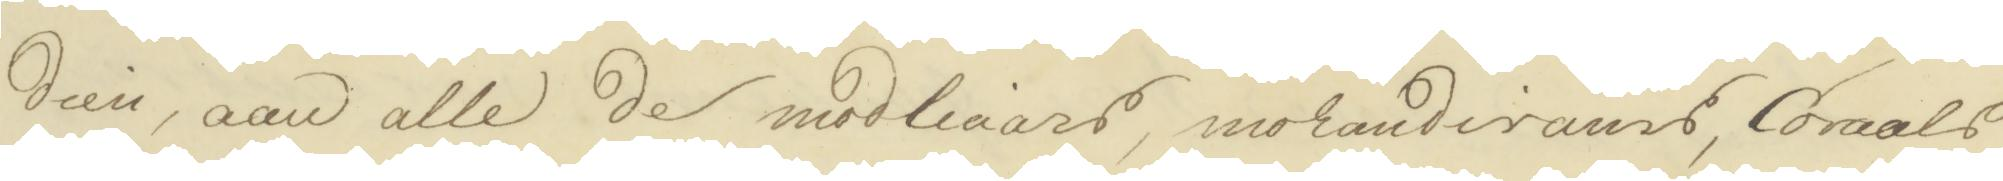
dien, aan alle de modliaars, mohandirams, Coraals
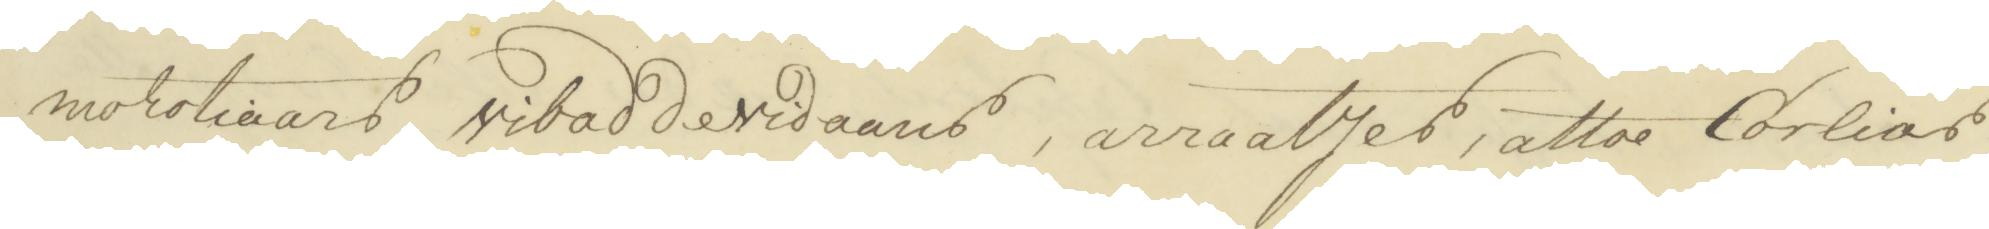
mohotiaars, vibad devidaans, arraatjes, attoe Corlias
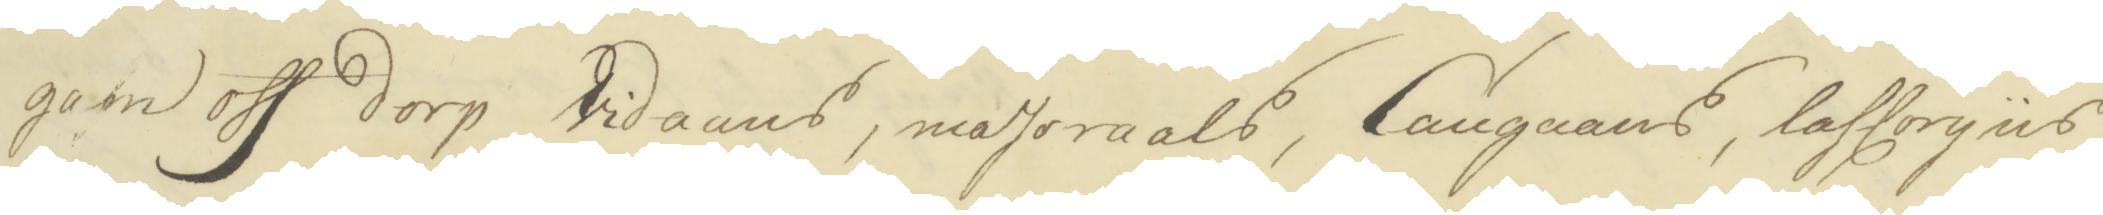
ga en off dorp Vidaans, majoraals, Caugaans, lascorijns,
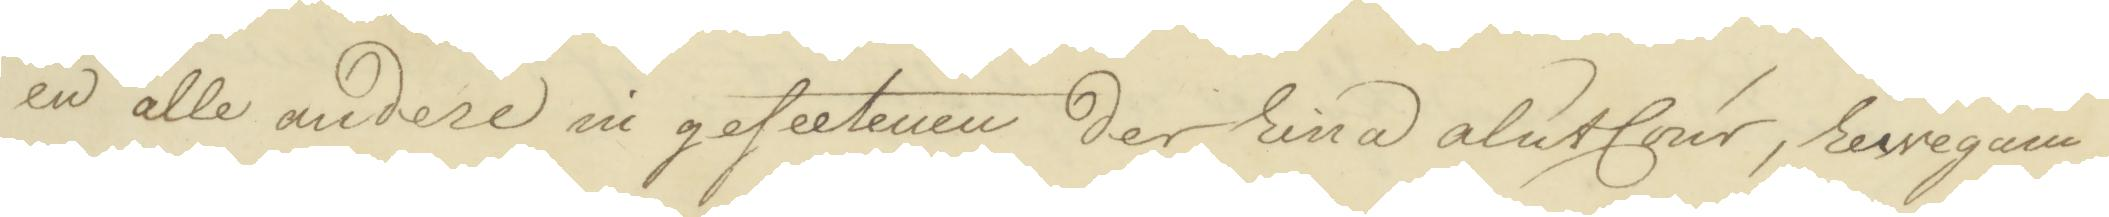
en alle andere in geseetenen der hina alutcour, hewegam
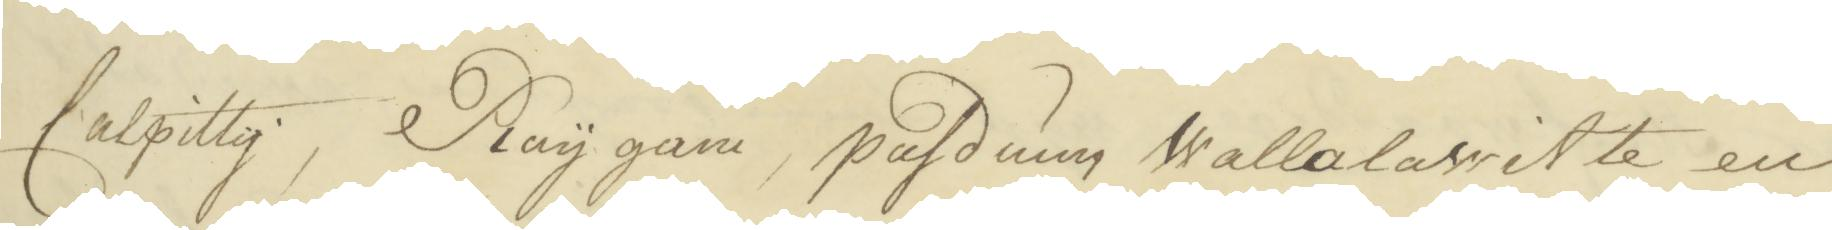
Calpittij, Raijgam, pasduny Wallalawitte en
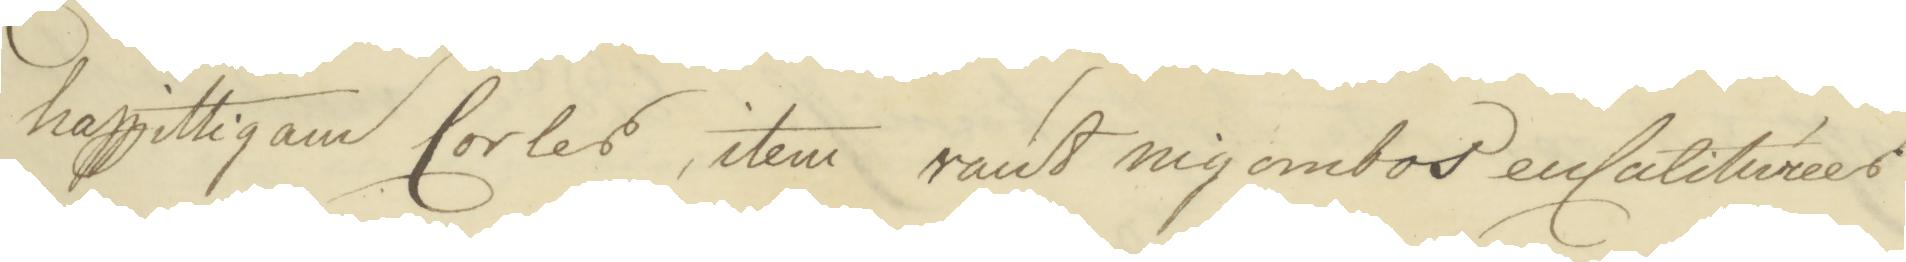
happittigam Corles, item van’t nig ombos encaliturees
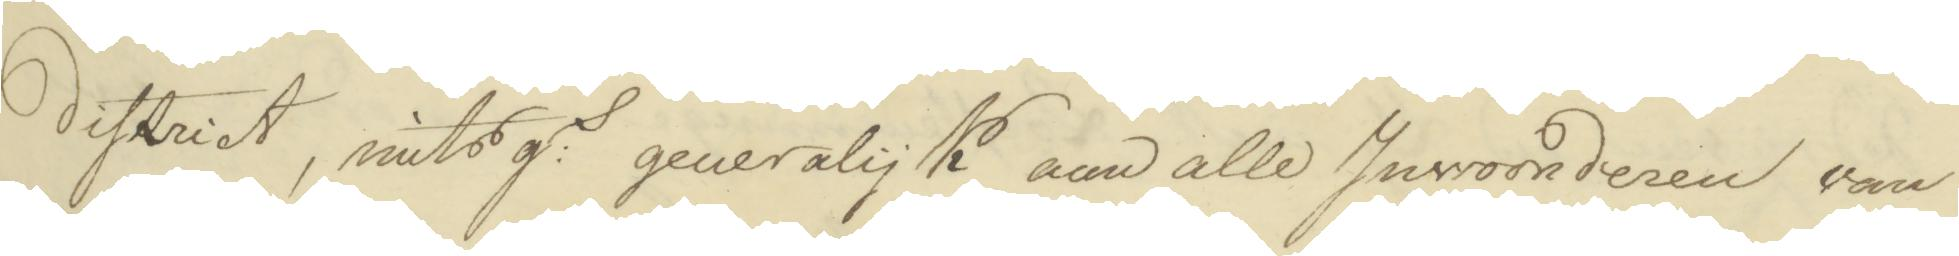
district, mitsg:s generalijk aan alle Jnwoonderen van
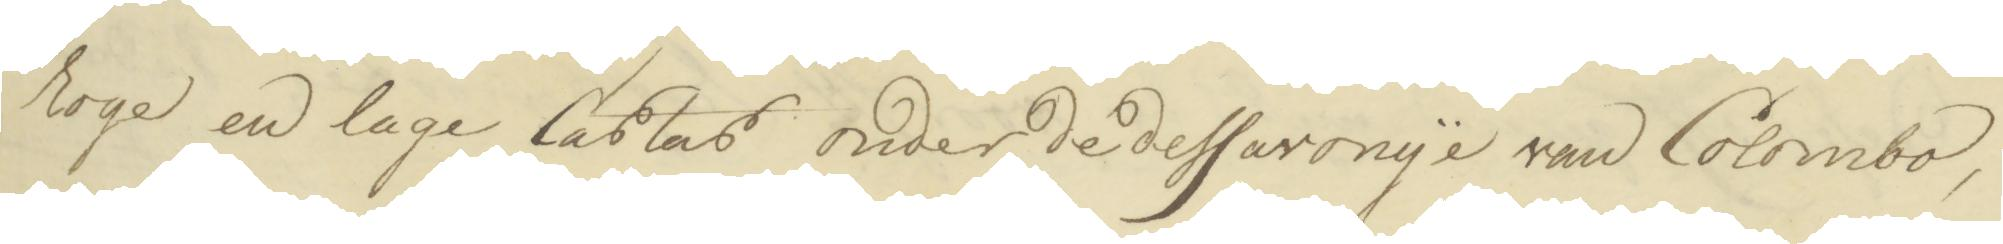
hoge en lage Castas onder de dessavonije van Colombo,
